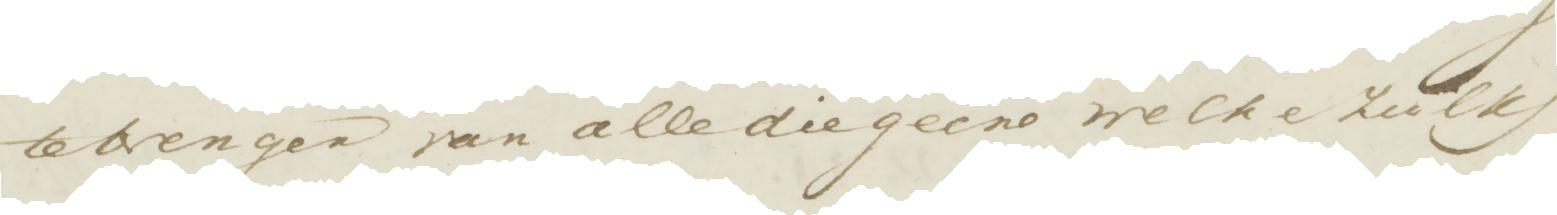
te brengen van alle die geene welke zulks
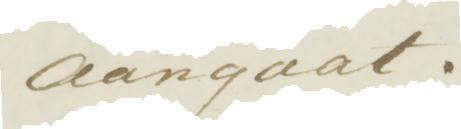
aangaat.
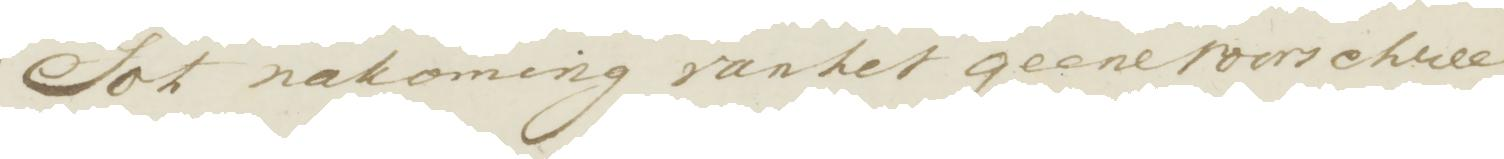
Tot nakoming van het geene voorschree
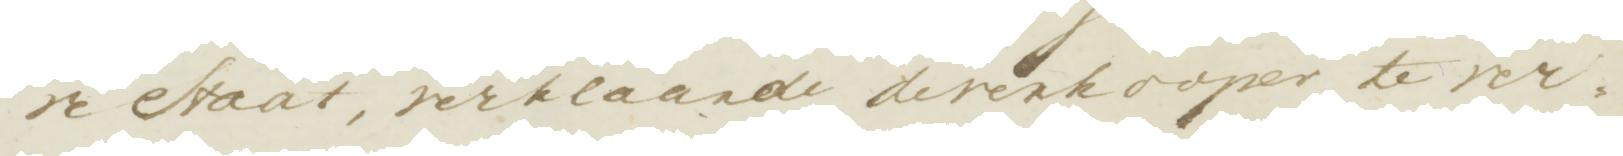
ve Staat, verklaarde de verkooper te ver„
